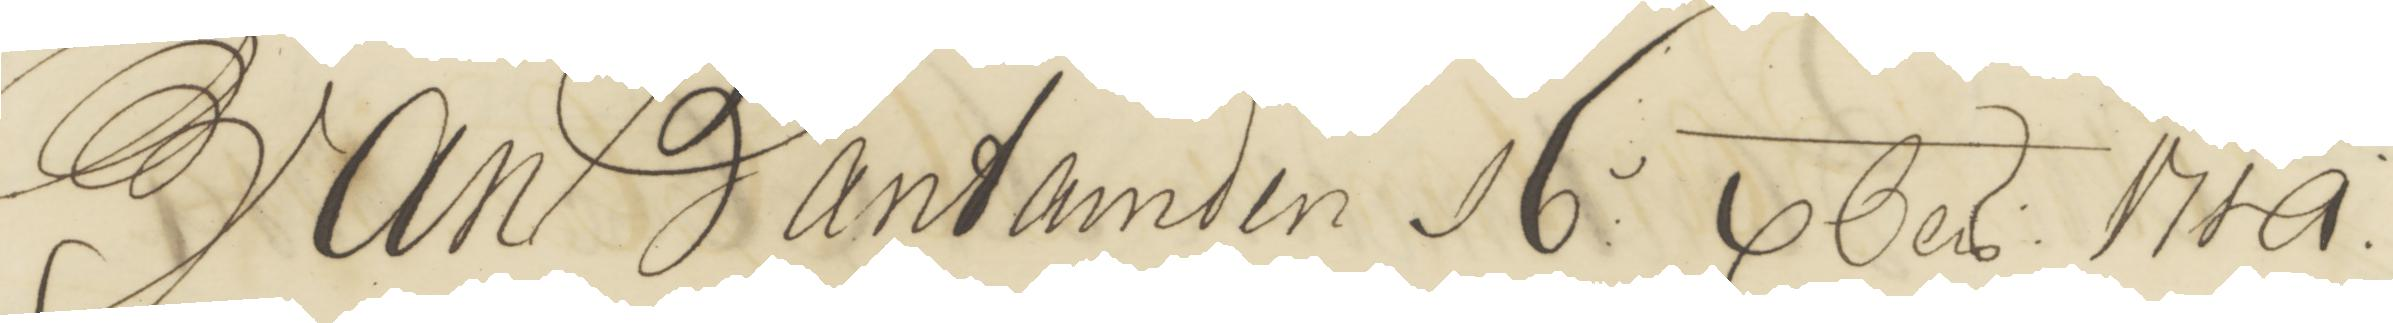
Van Bantam den 16:' xber: 1714.
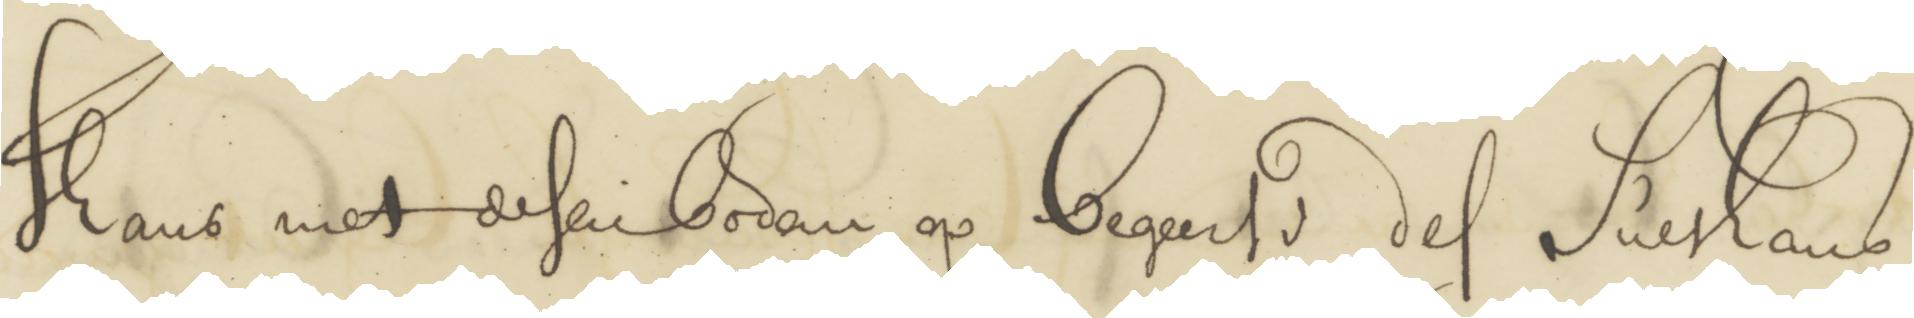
thans met desen bodem op begeerte des sulthans
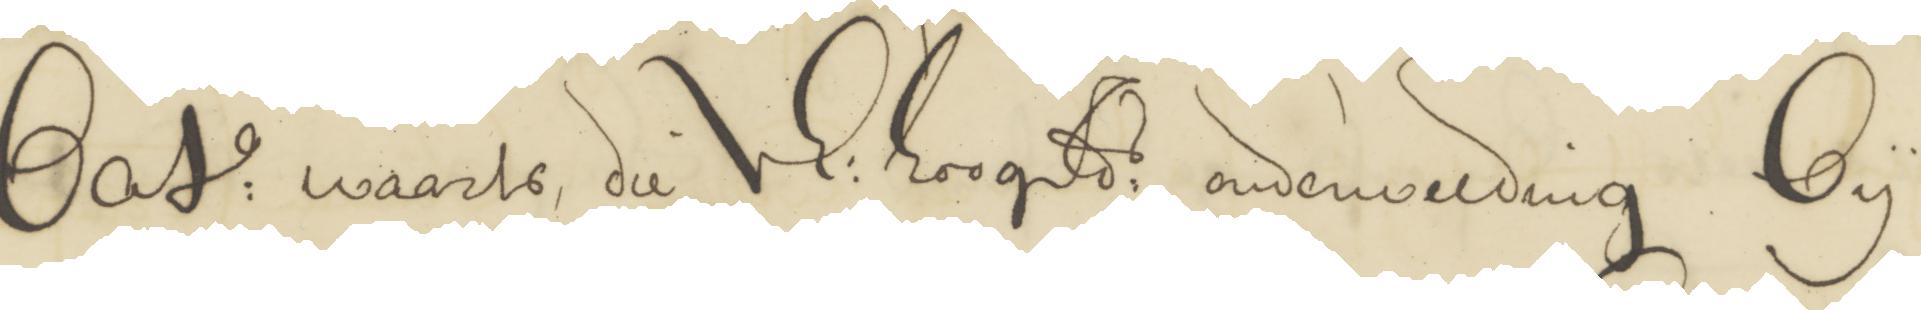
bat: waarts, die VE: hoog Ed:s ondervnding bij
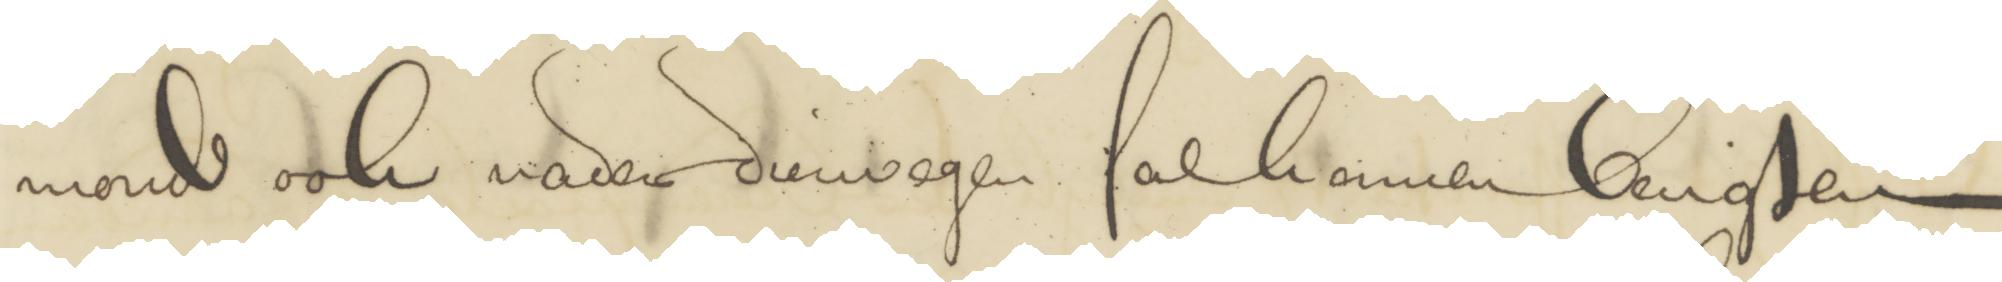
monde ook nader diewegen sal konnen berigten
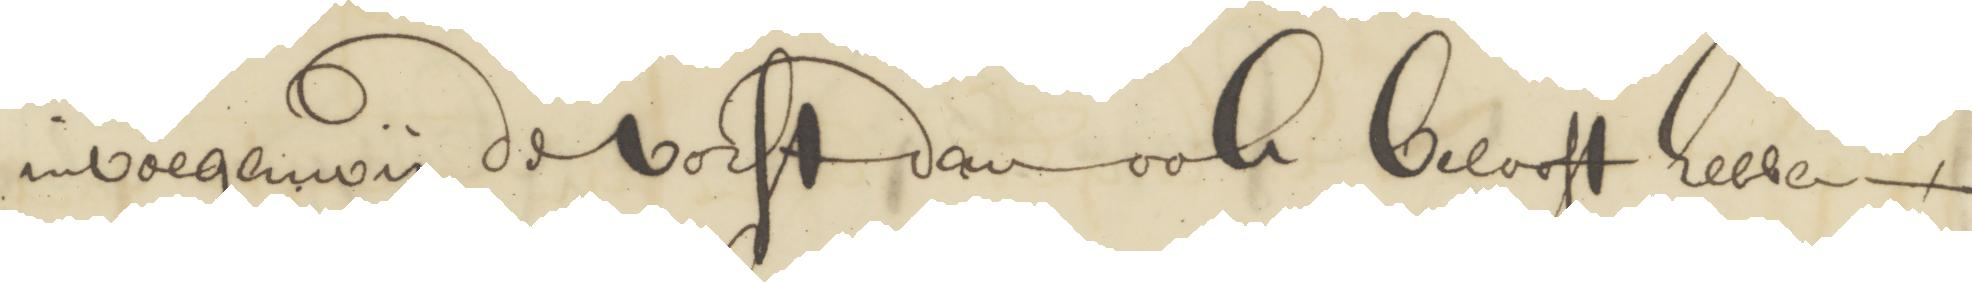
invoegen wij de vorst dan ook belooft hebben
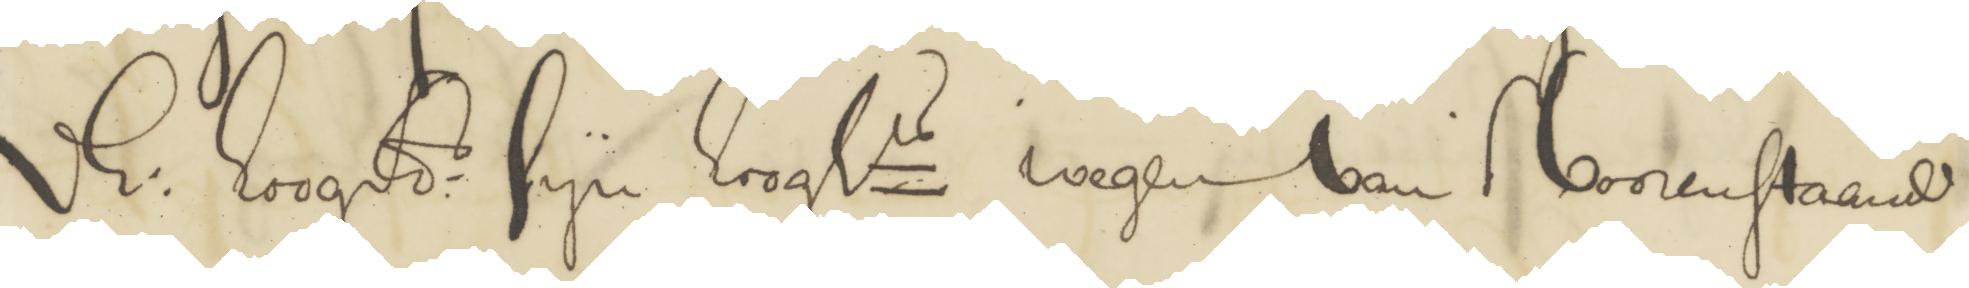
VE: hoog Ed:s sijn hoogh=ts wegen van ’t voorenstaande
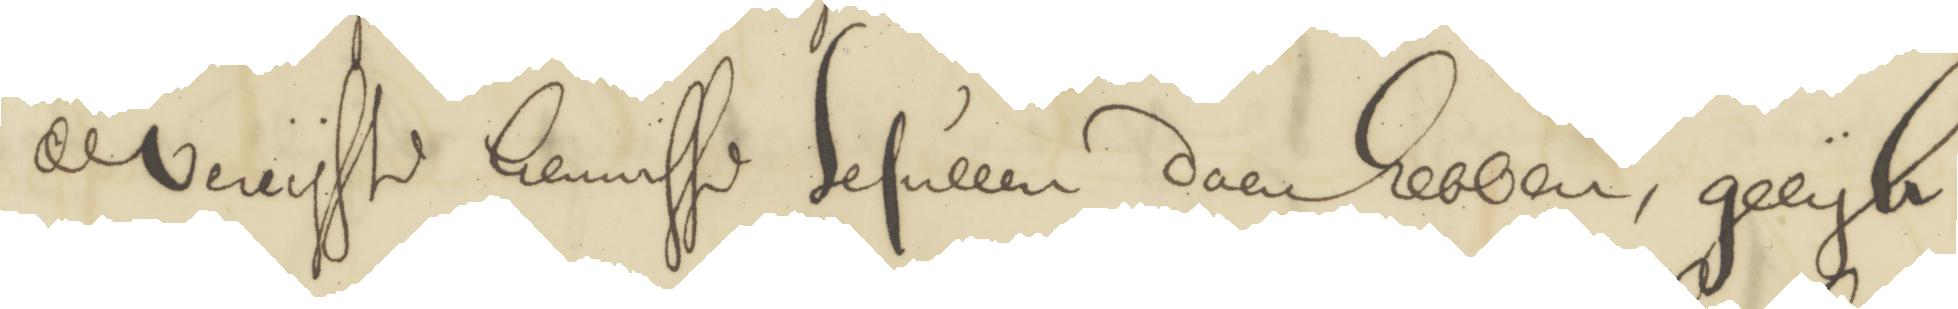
de vereijste kennisse te sullen doen hebben, gelijk
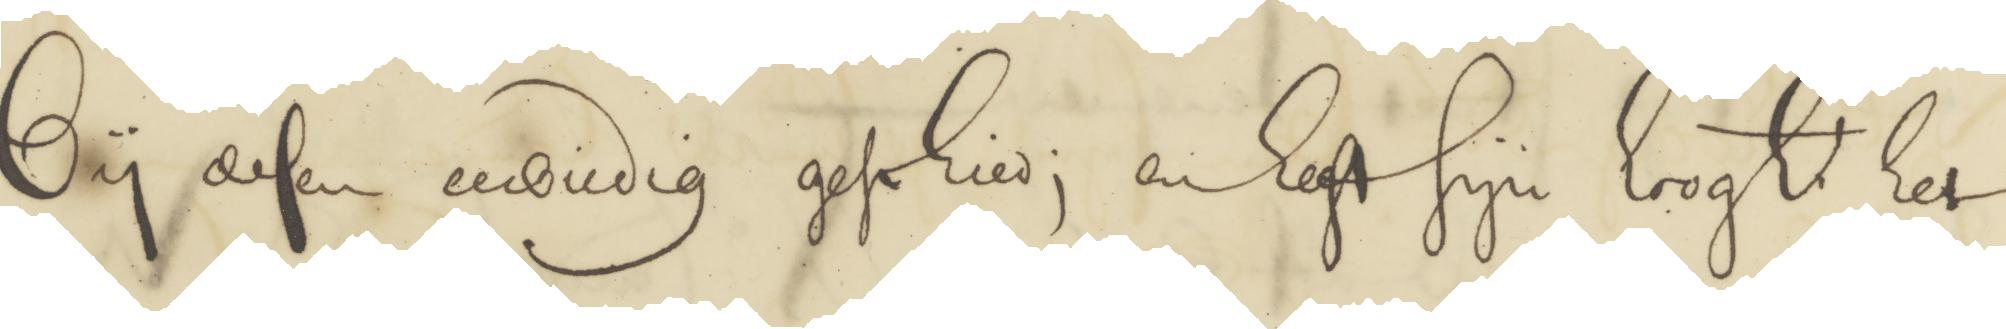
bij desen eerbiedig geschied; en heeft sijn hoogh:t het
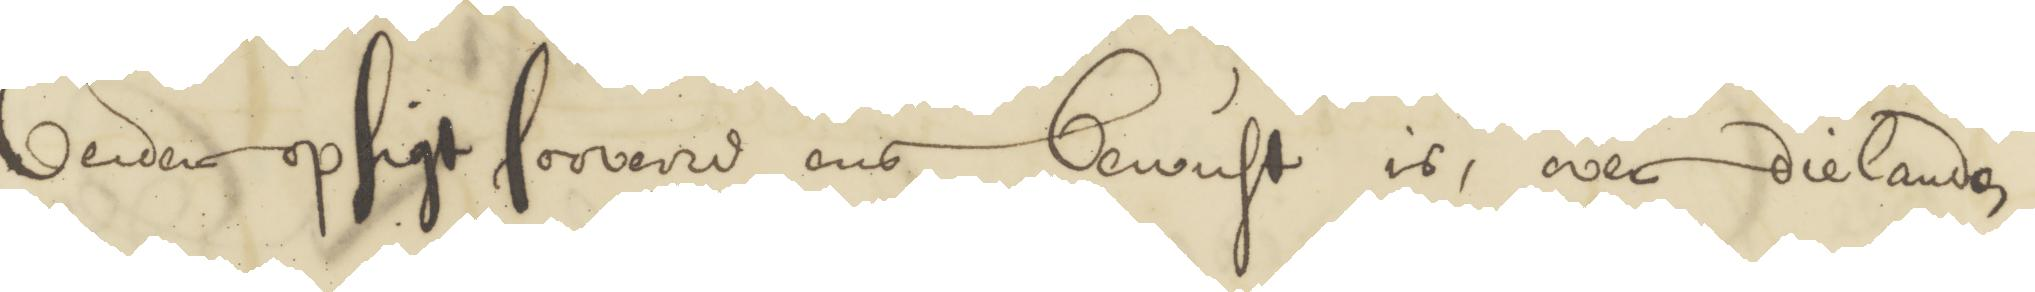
verder opsigt sooverre ons bewust is, over die landen
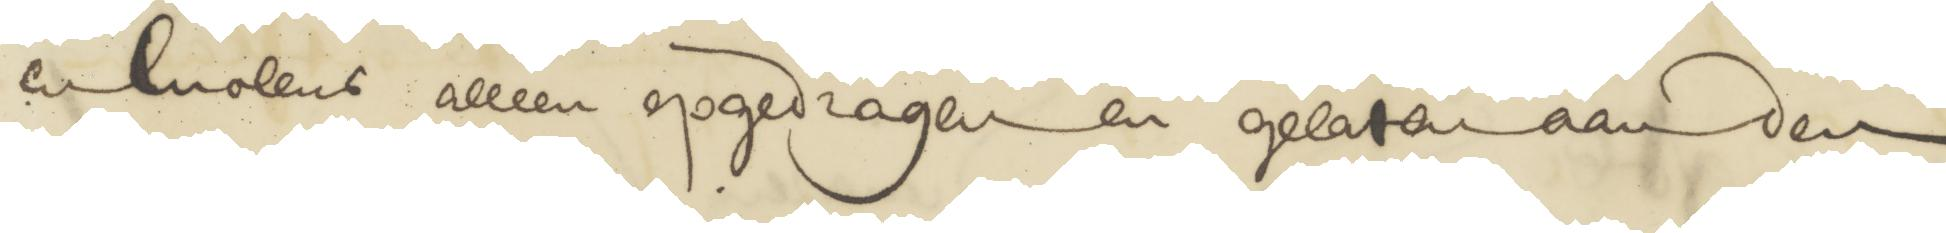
te krolens alleen opgedragen en gelaten aan den
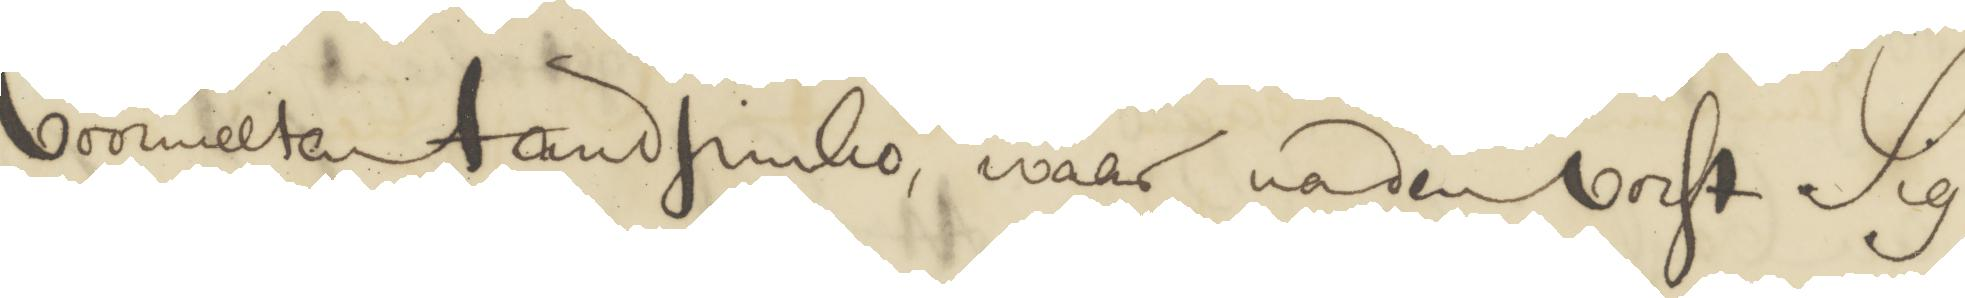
voormelten tandjimko, waar na den vorst sig
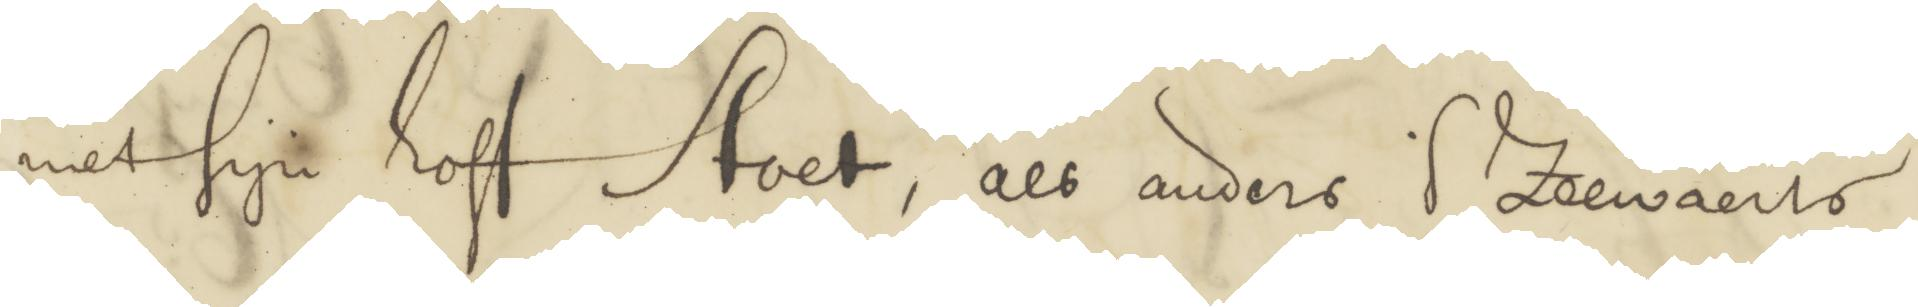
met sijn hoff stoet, als anders 't zeewaerts
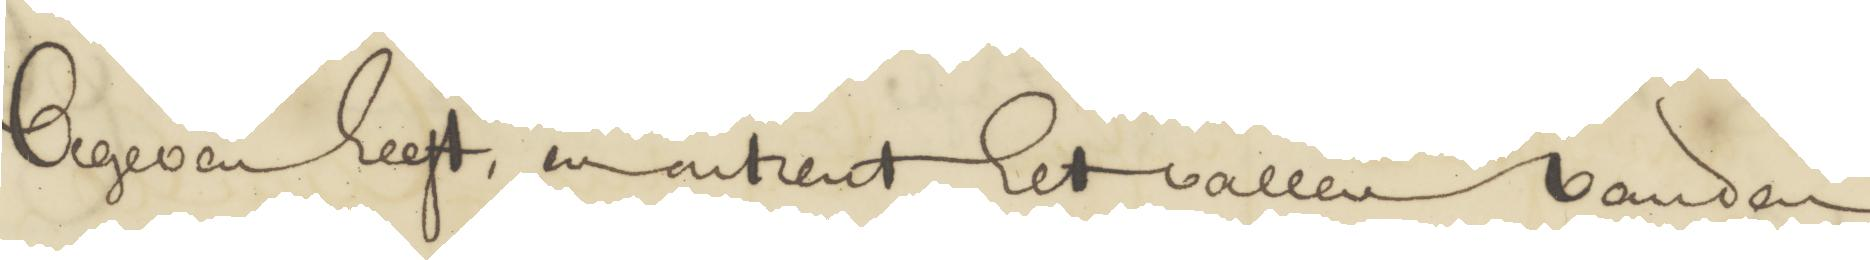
begeven heeft, en ontrent het vallen van den
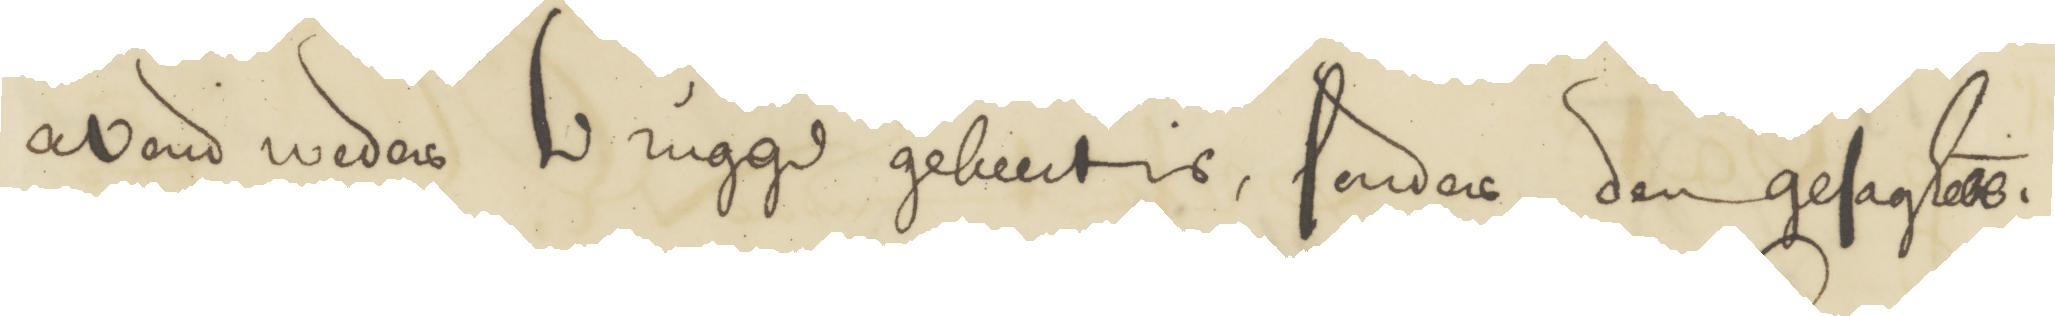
avond weder te rugge gekeert is, sonder den gesaghebb:
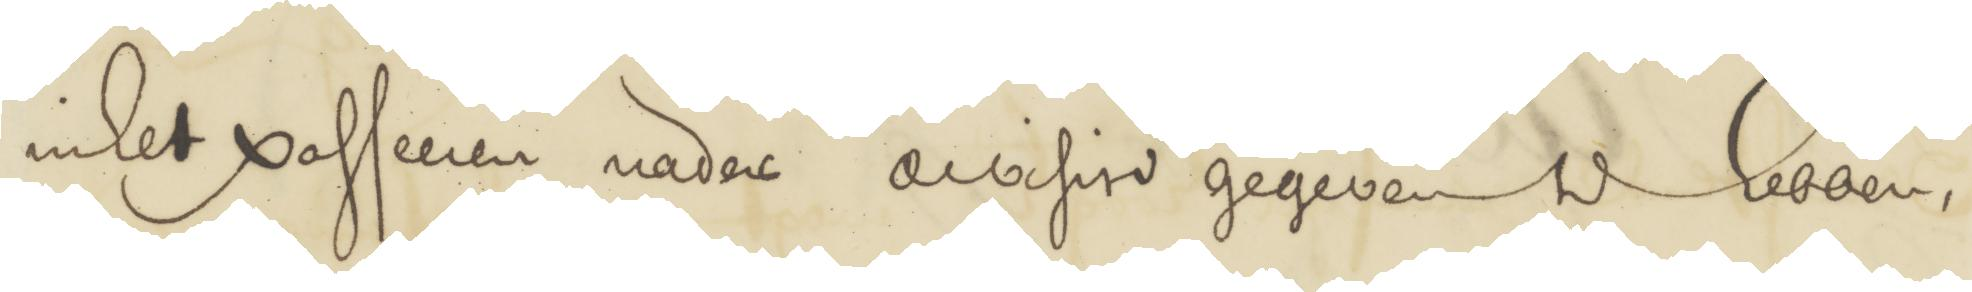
in het passeeren nader de visite gegeven te hebben,
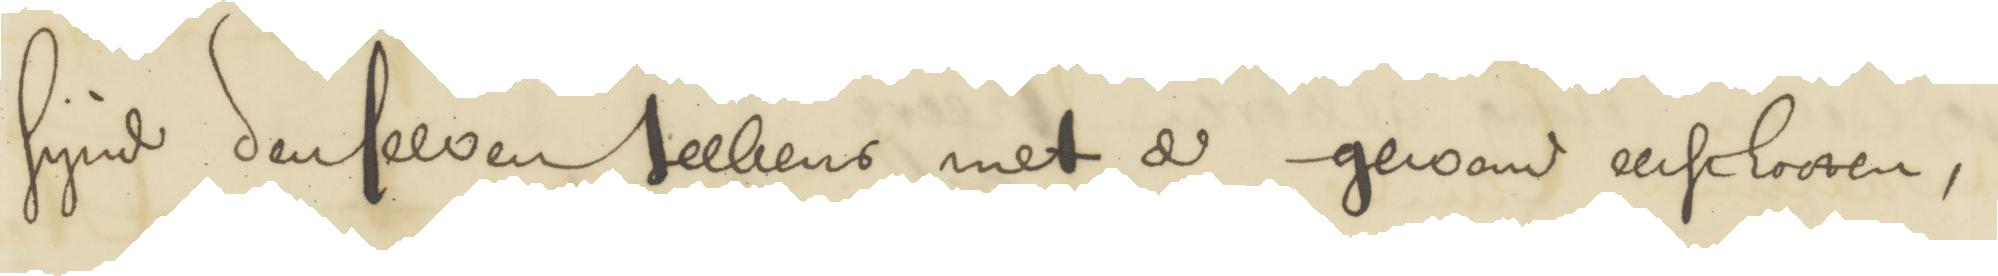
sijne denselven telkens met de gewone verschooten,
